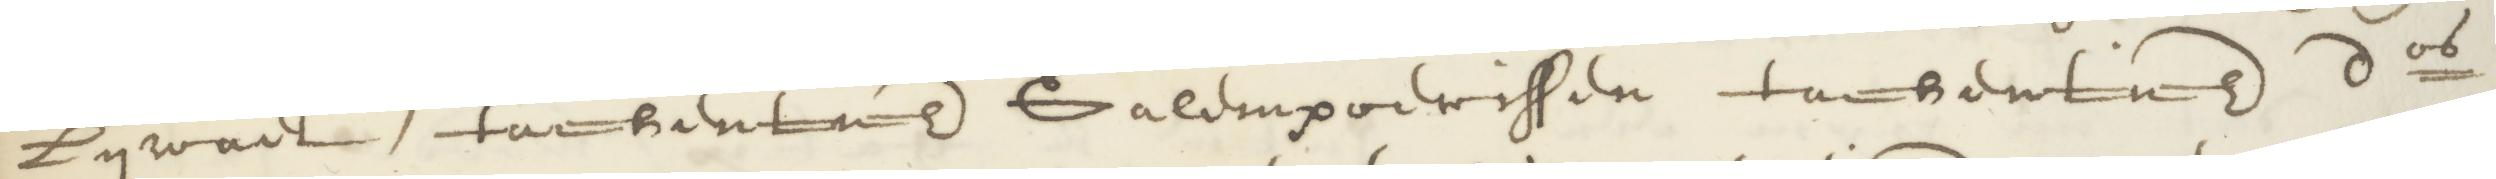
Lijwaet, tachentich Calempoerissen tachentich d=os
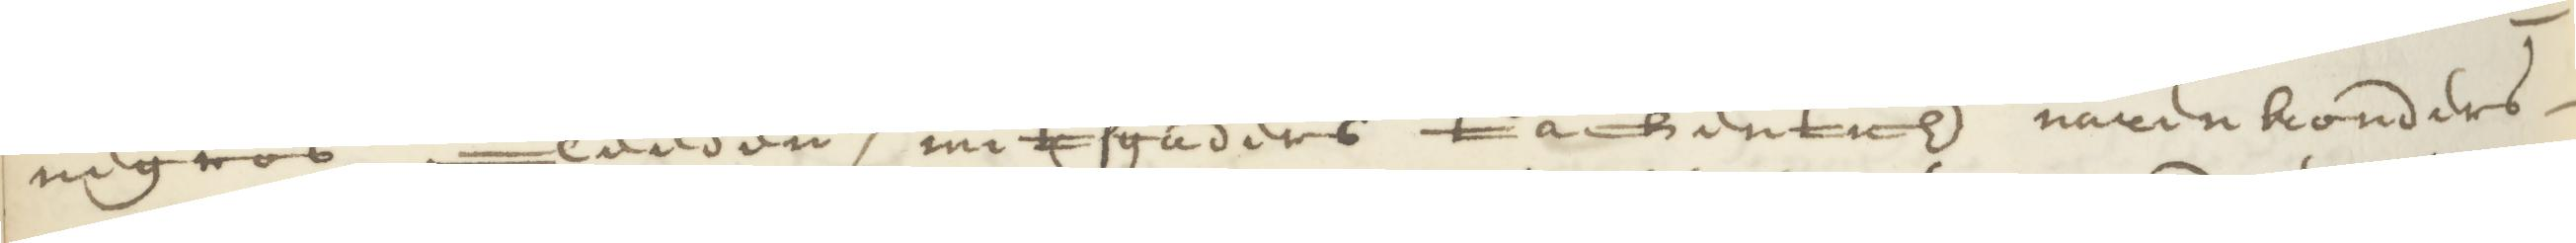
negros cleeden, mitsgaders t'achentich narenkonders-
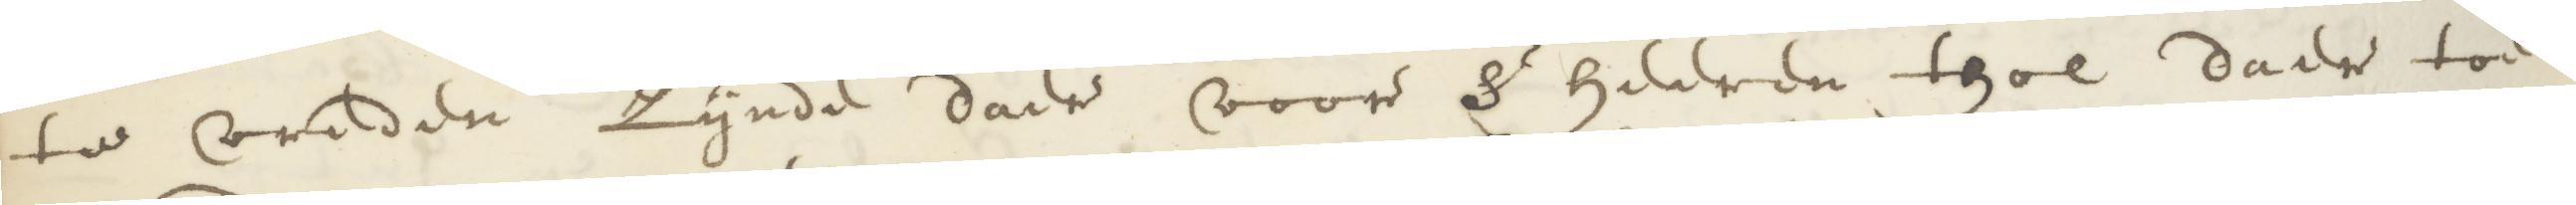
te vreden zijnde daer voor s' heeren thol daer toe
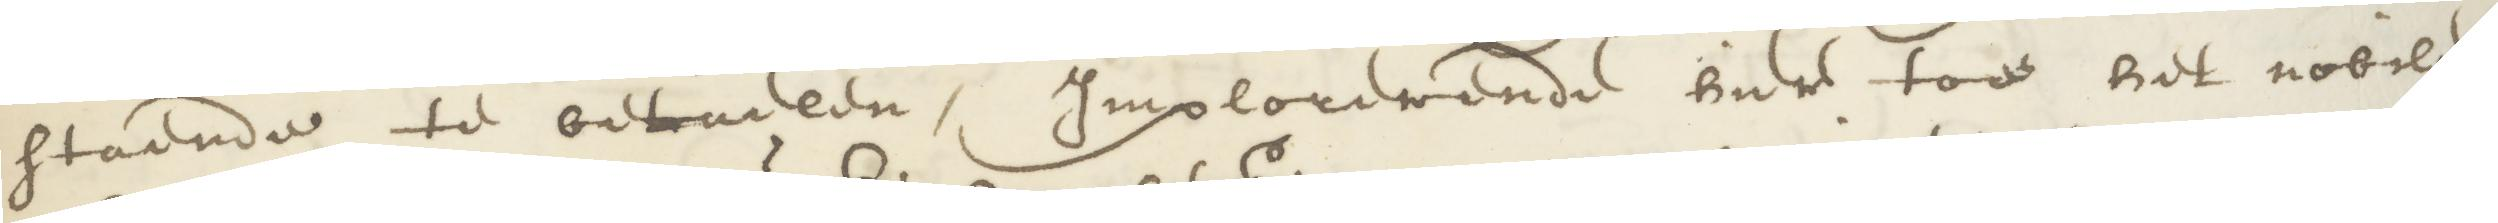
staende te betaelen, Jmplorerende hier toe het nobile
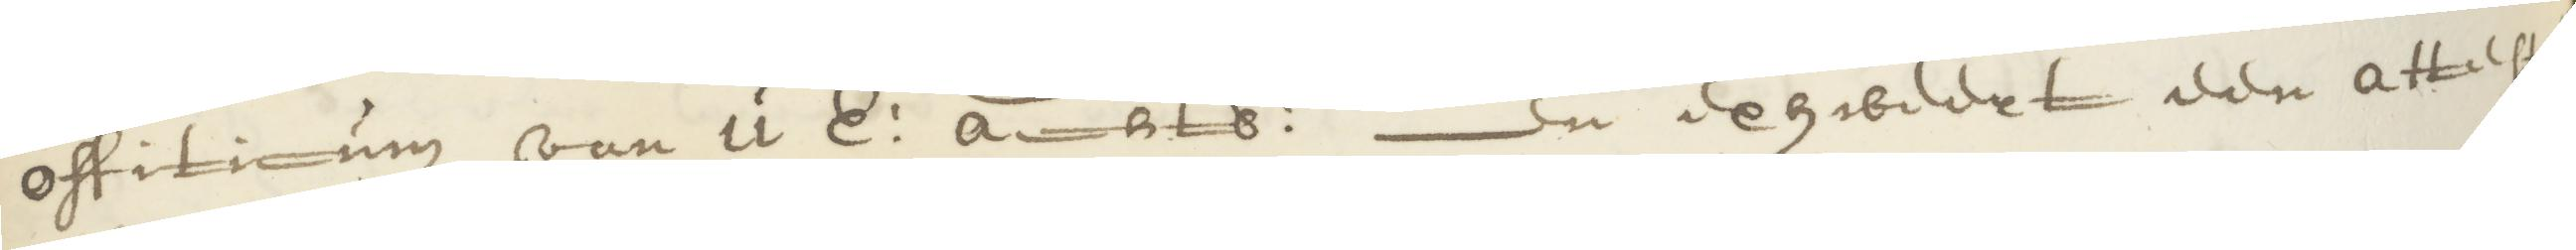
offiticum van u E: achtb: en exhibeert een attestat
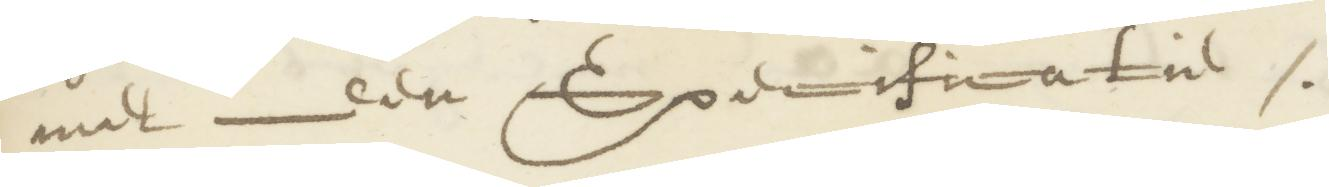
met een Specificatie/.
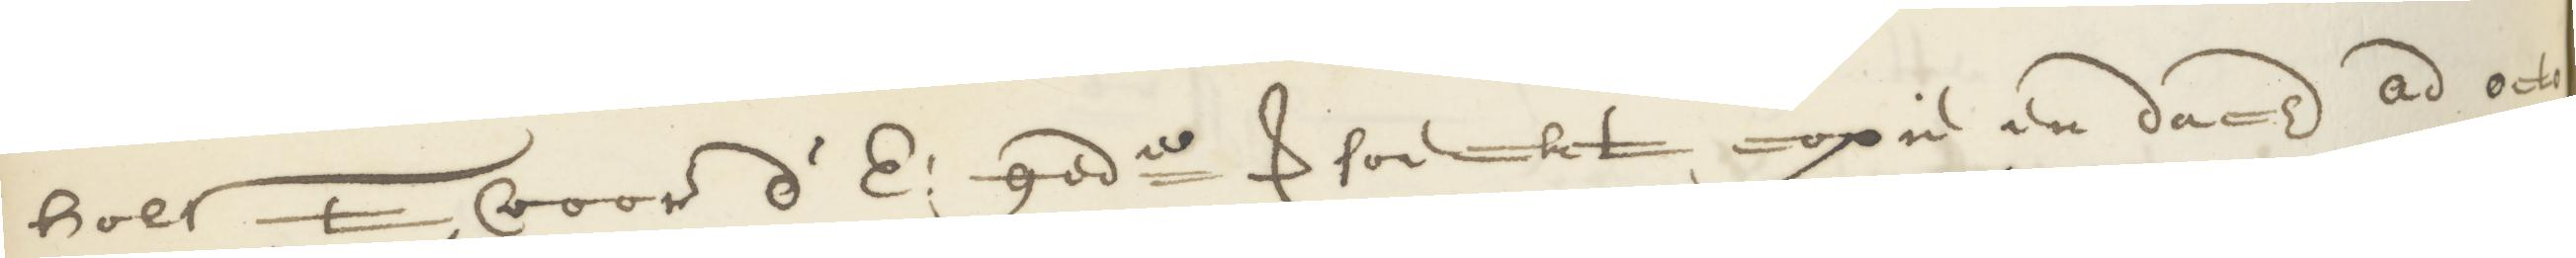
holst voor d’ E: ged=e versoeckt copie en dach ad octo
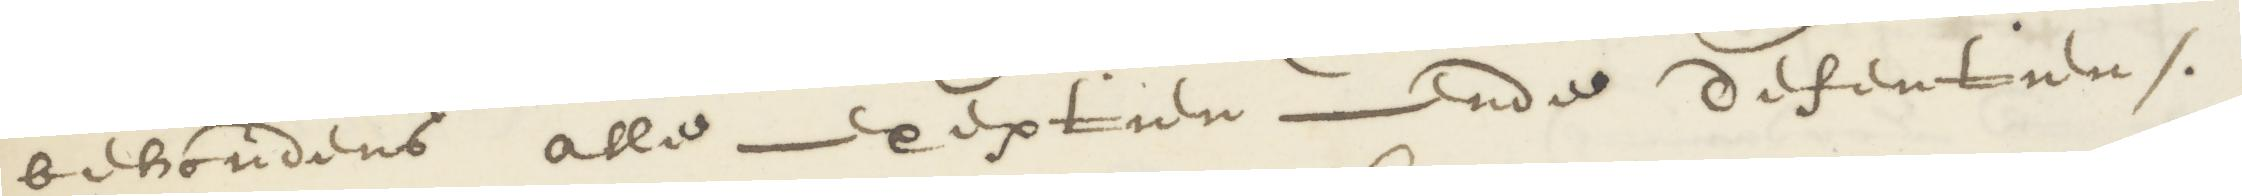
behoudens alle exeptien ende defentien/.
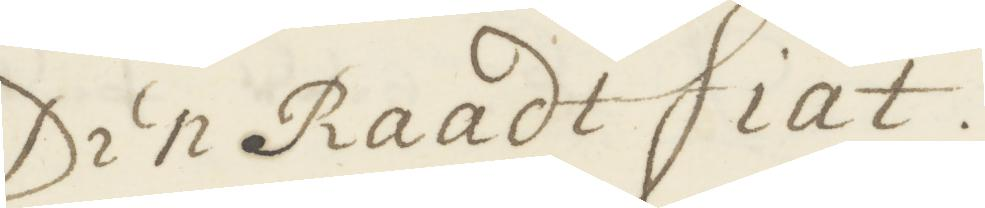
Den Raadt fiat.
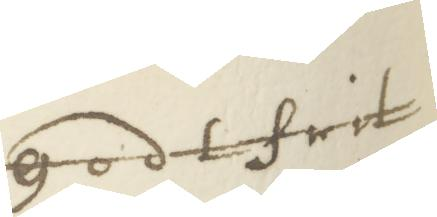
godtfrit
